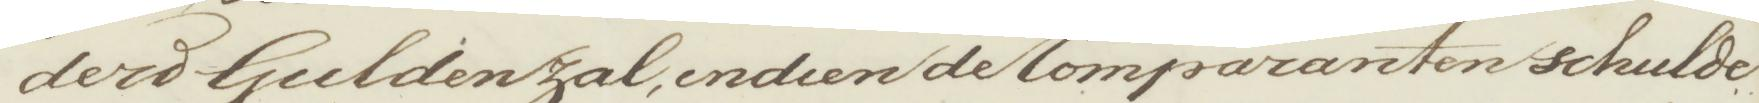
derd Gulden zal, indien de Comparanten schulde
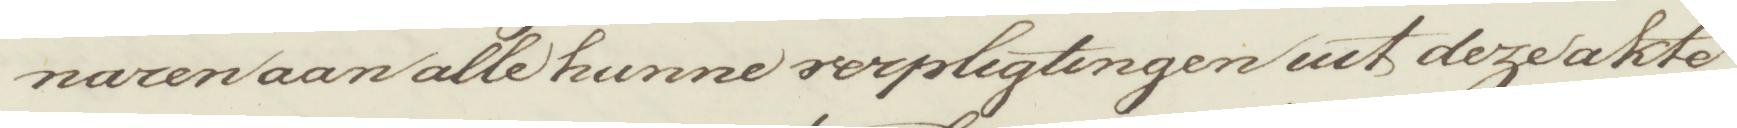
naren aan alle hunne verpligtingen uit deze akte
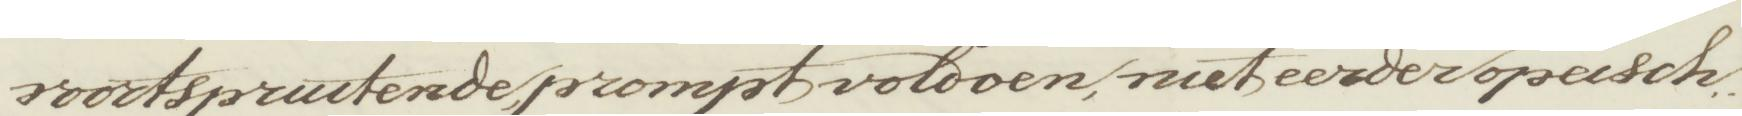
voortspruitende prompt voldoen, niet eerder opeisch„
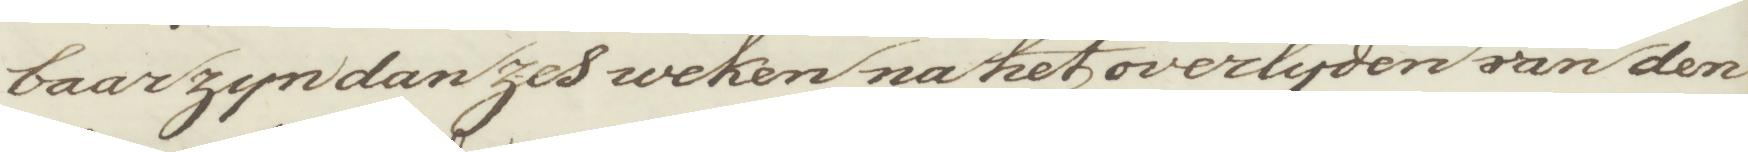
baar zyn dan zes weken na het overlyden van den
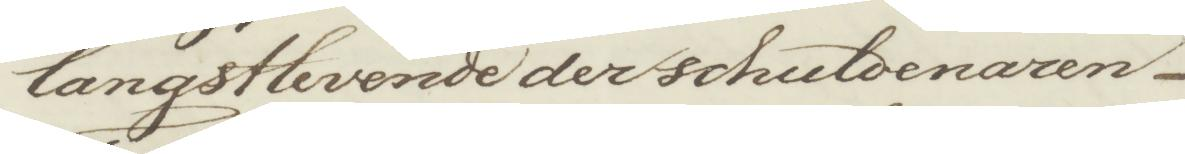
langstlevende der schuldenaren-
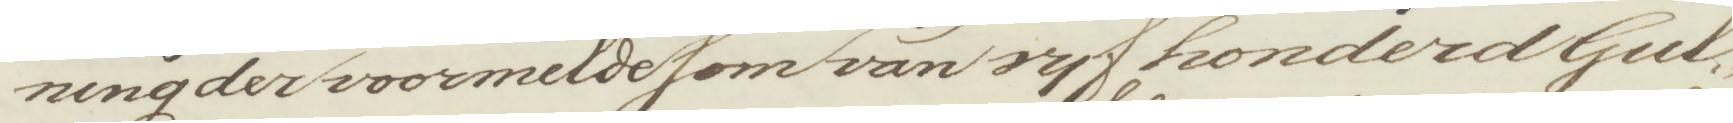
ning der voormelde som van vyf honderd Gul„
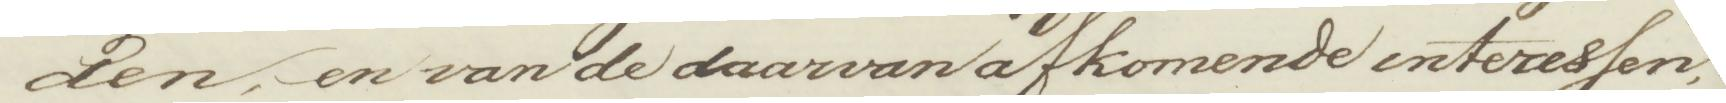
den, en van de daarvan afkomende interessen,
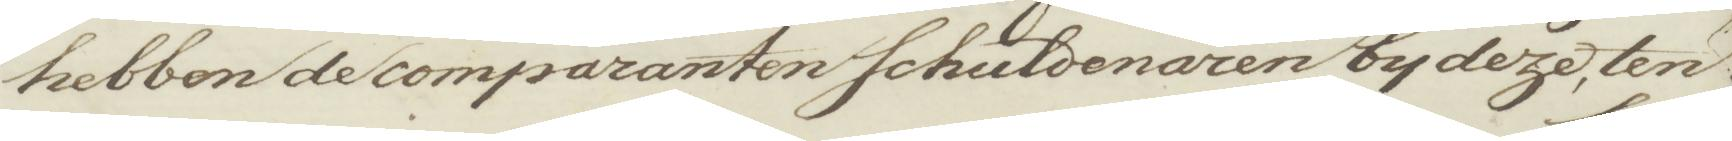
hebben de comparanten schuldenaren by deze, ten
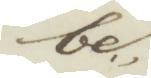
be„
